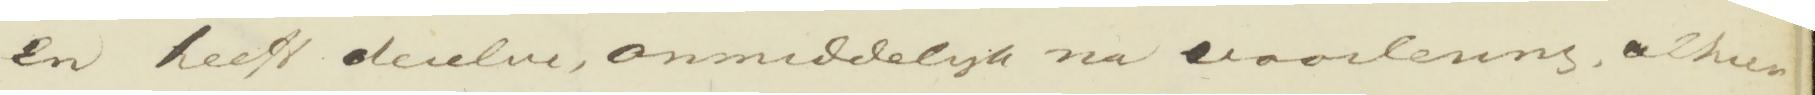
En heeft dezelve, onmiddelijk na voorlezing, alhier
